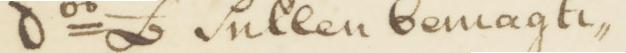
d=os te sullen bemagti„
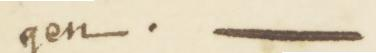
gen. —
